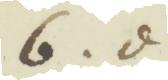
6. d
